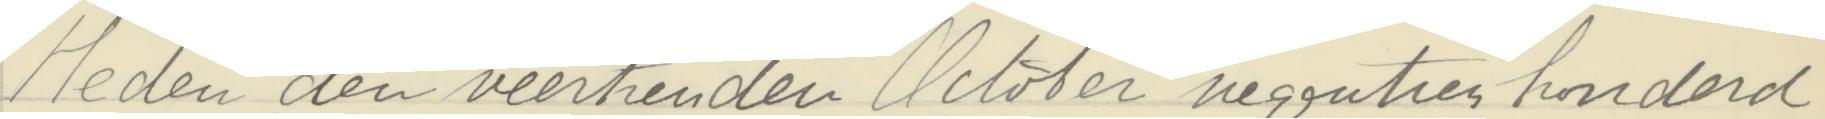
Heden den veertienden October negentien honderd
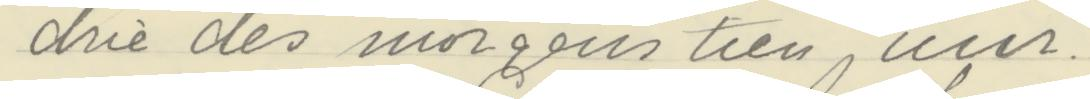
drie des morgens tien uur.
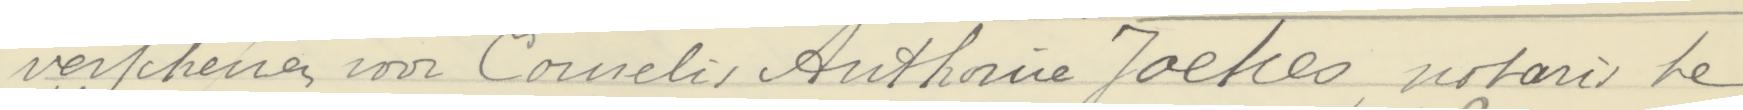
verschenen voor Cornelis Anthonie Joekes, notaris te
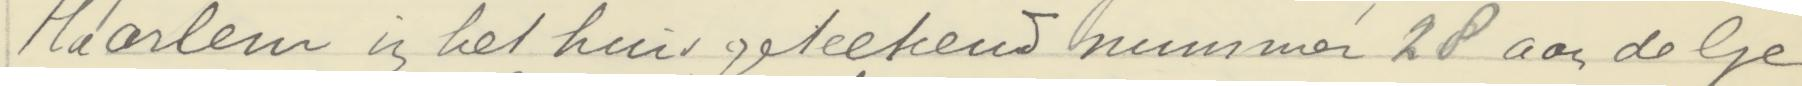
Haarlem in het huis geteekend nummer 28 aan de Ge
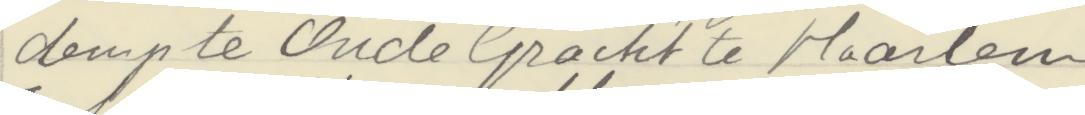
dempte Oude Gracht te Haarlem
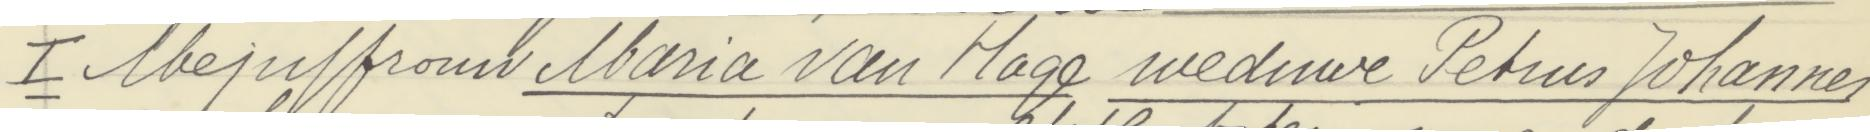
I Mejuffrouw Maria van Hage weduwe Petrus Johannes
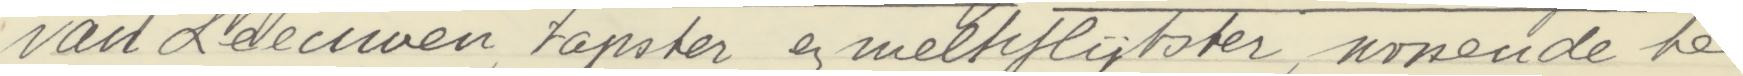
van Leeuwen, tapster en melkslijtster, wonende te
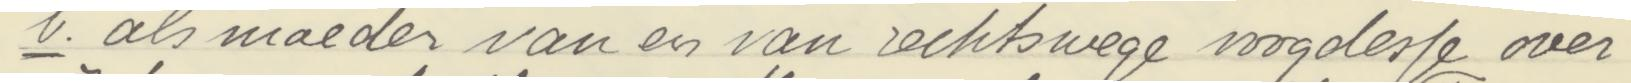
b. als moeder van en van rechtswege voogdesse over
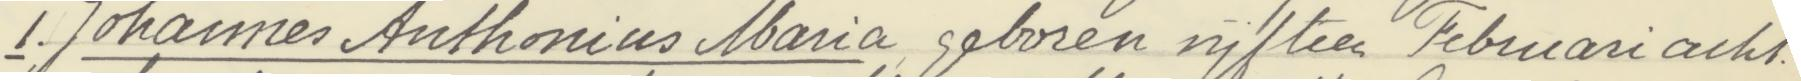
1. Johannes Anthonius Maria, geboren vijftien Februari acht.
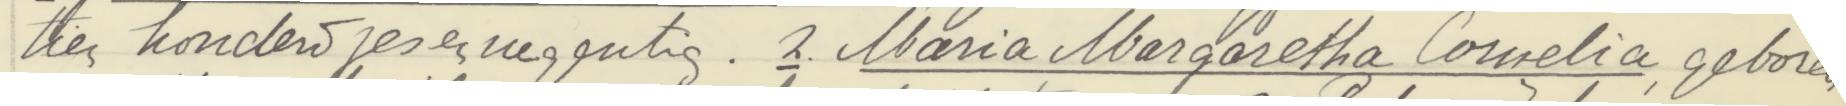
tien honderd zes en negentig. 2. Maria Margeretha Cornelia, geboren
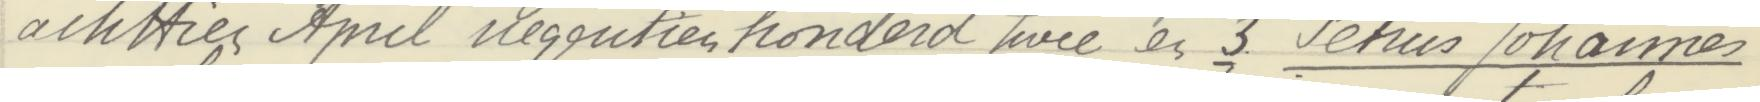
achttien April Negentien honderd twee en 3. Petrus Johannes
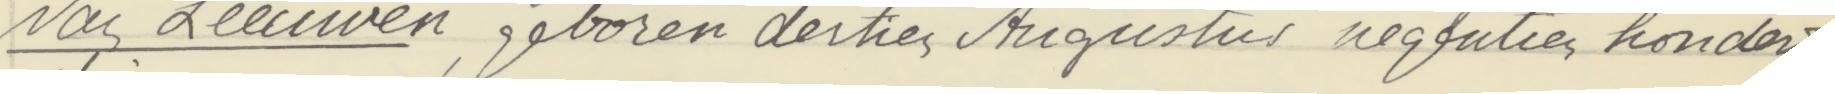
van Leeuwen, geboren dertien Augustus negentien honderd
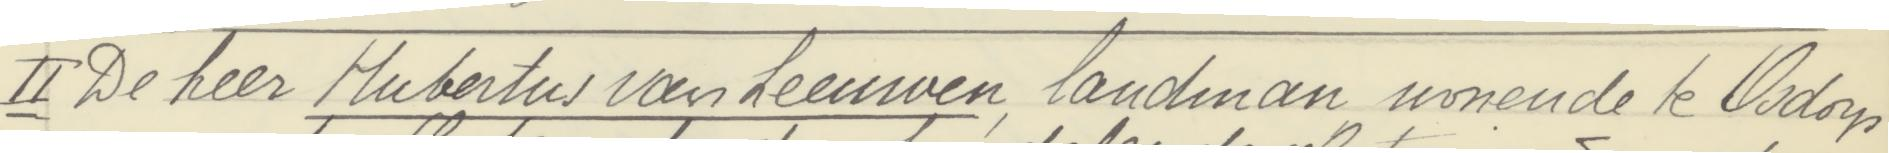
II De heer Hubertus van Leeuwen, landman, wonende te Osdorp
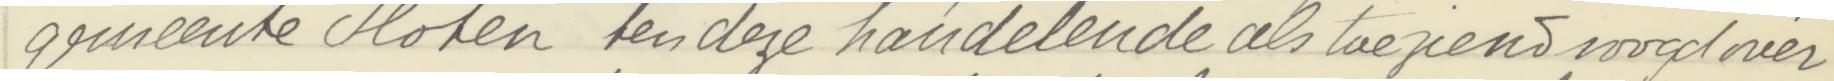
gemeente Sloten, ten deze handelende als toeziend voogd over
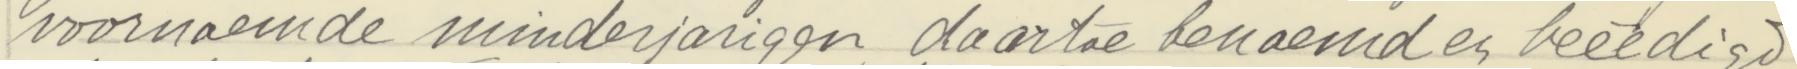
voornoemde minderjarigen, daartoe benoemd en beëedigd
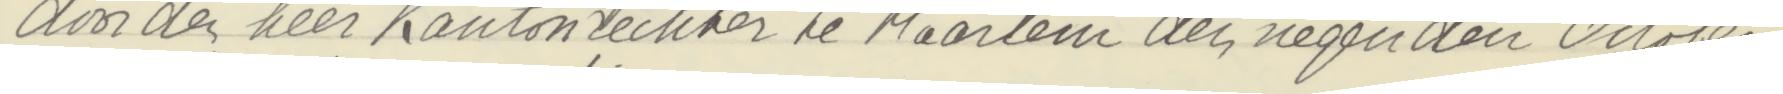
door den heer Kantonrechter te Haarlem den negenden October
